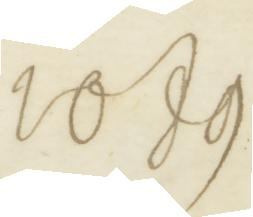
1089
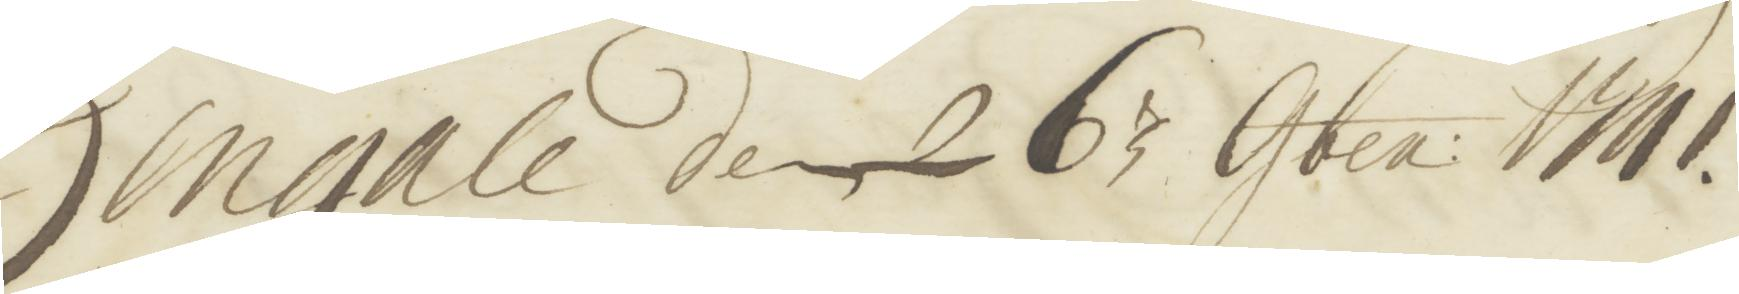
Van Bengale den 26„e 9ber: 1741.
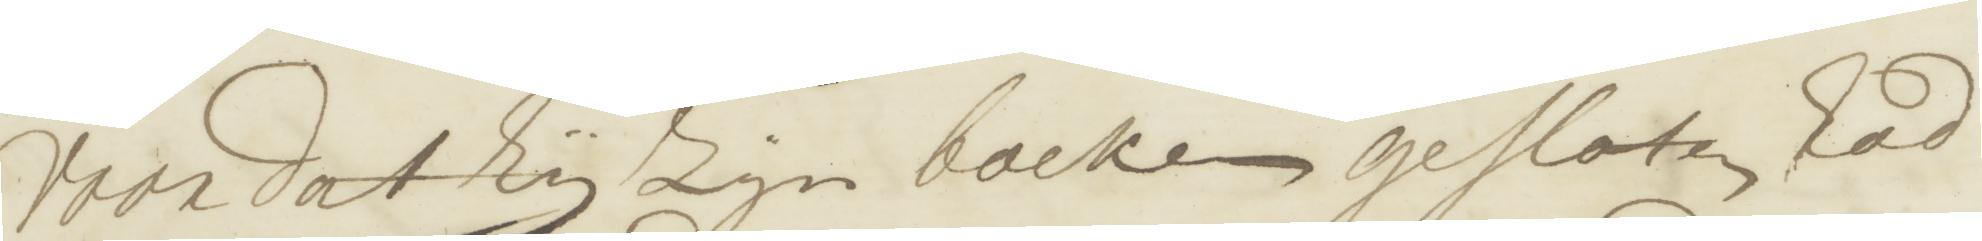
voor dat hij zijn boeken gesloten had
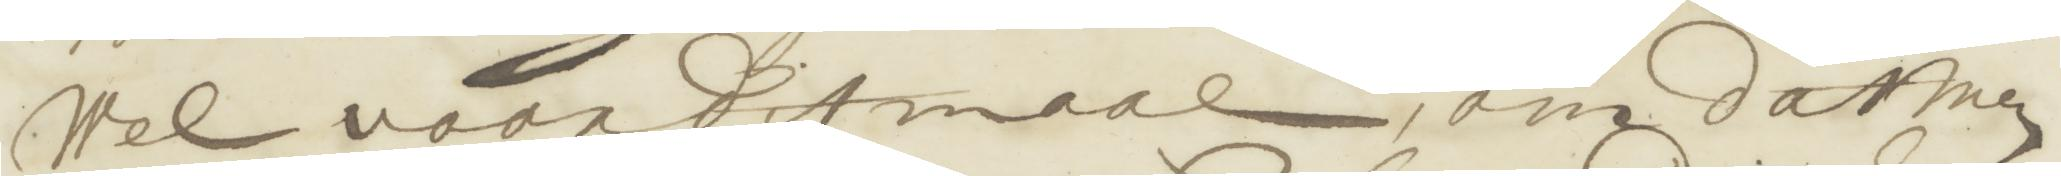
wel voor ditmaal, om dat men
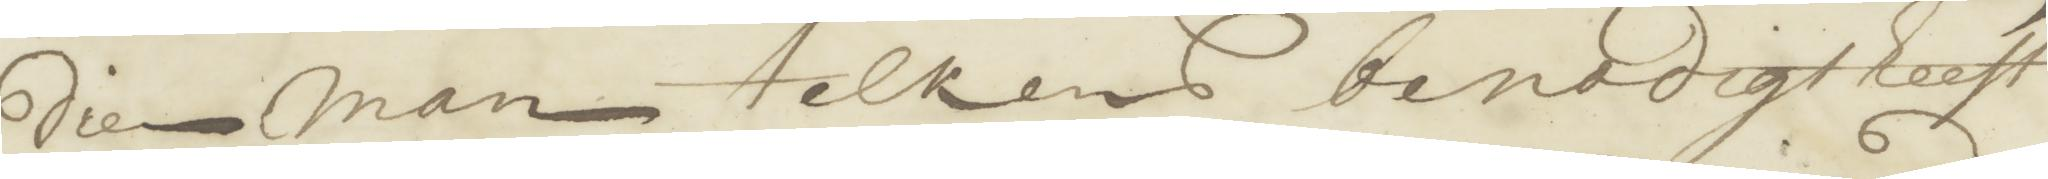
dien man telkens benodigt heeft
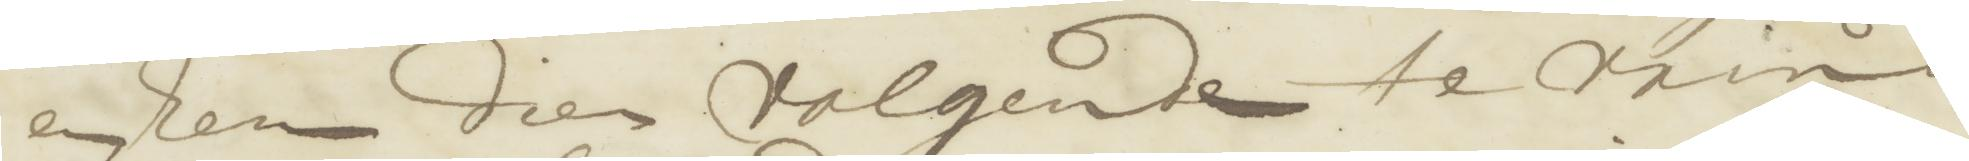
en hen dien volgende te vrind
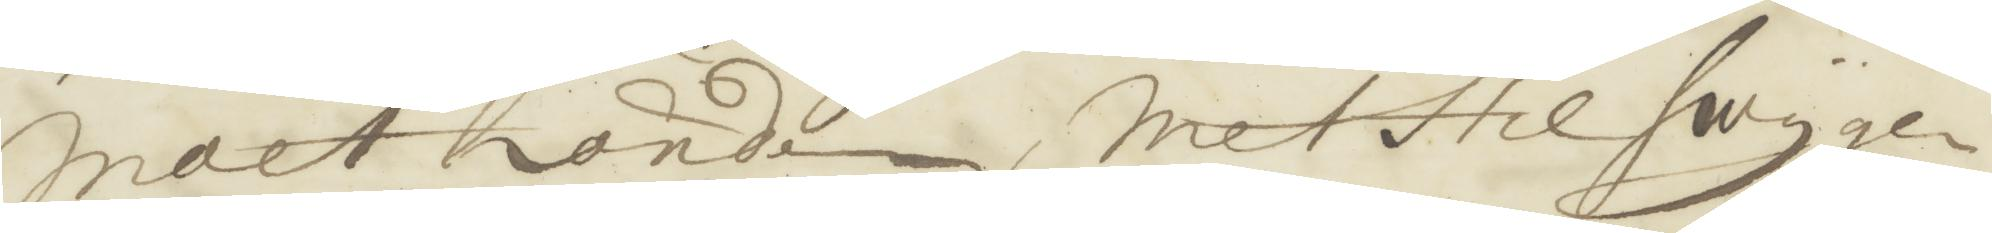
moet houden, met stilswijgen
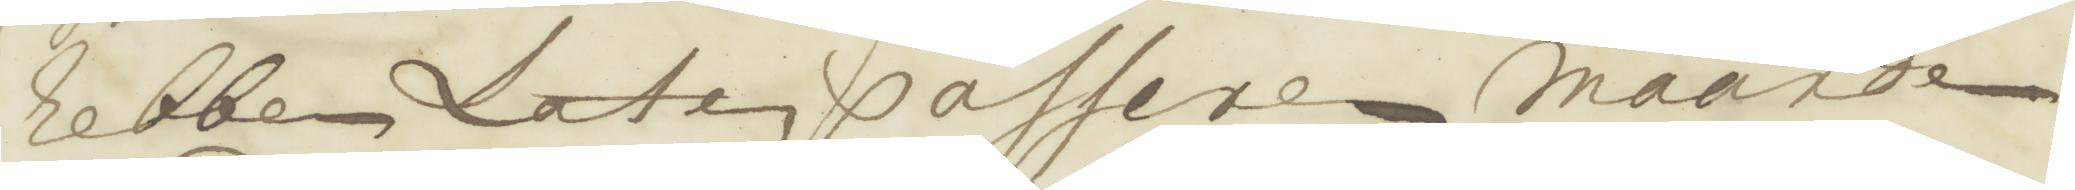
hebben laten passeren maar den
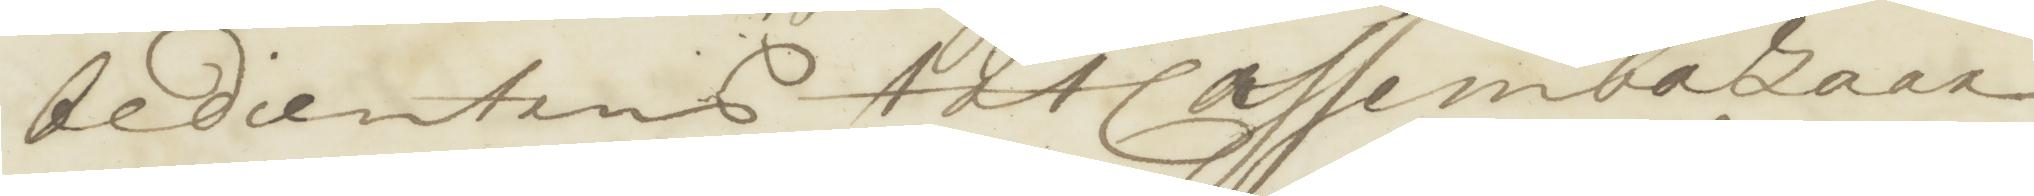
bedientens tot Cassembazaar
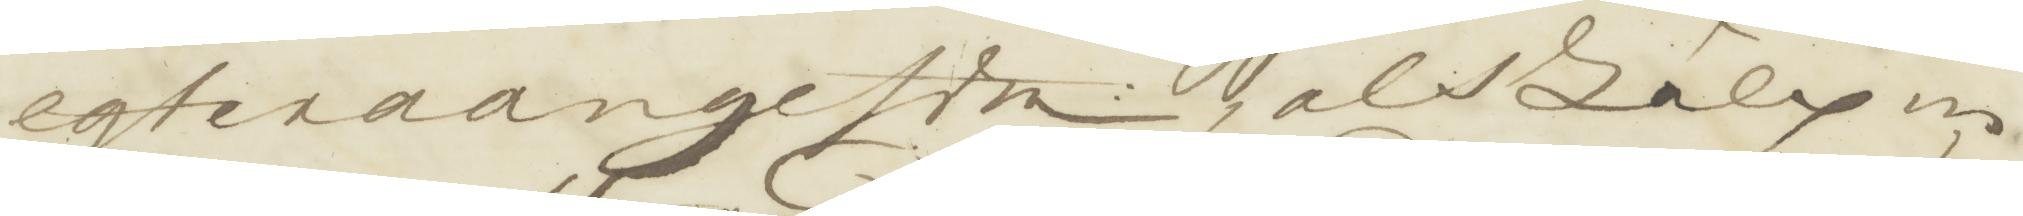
egter aan geschr:, als zulx in
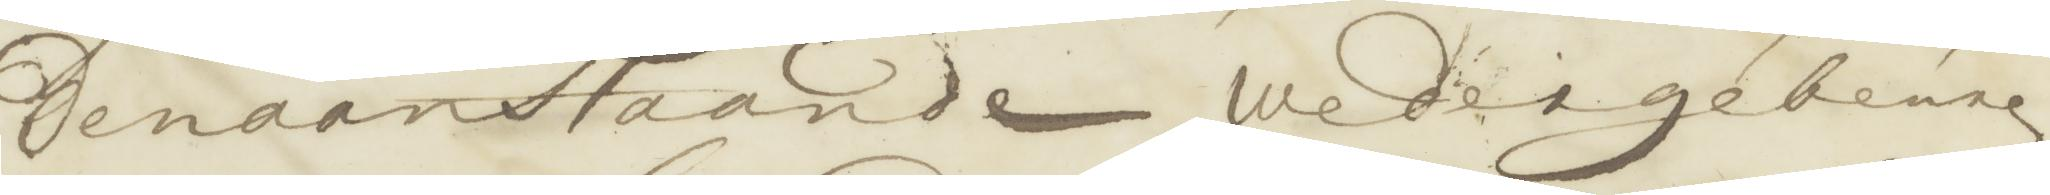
den aanstaande weder gebeuren
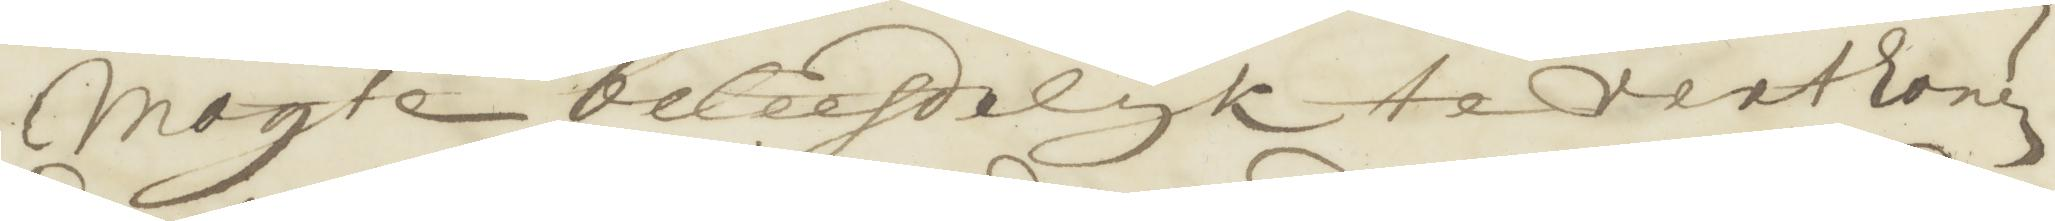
mogte beleefdelijk te verthonen
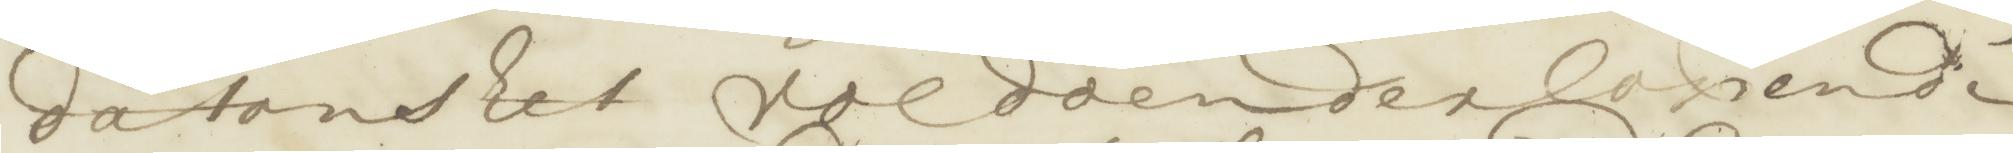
dat ons het voldoen der lopende
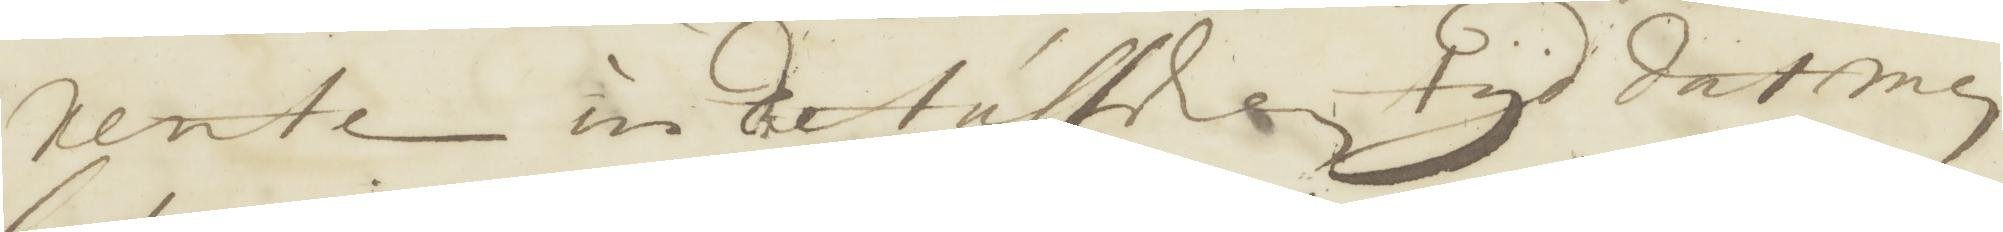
rente in de tusshen tijd dat men
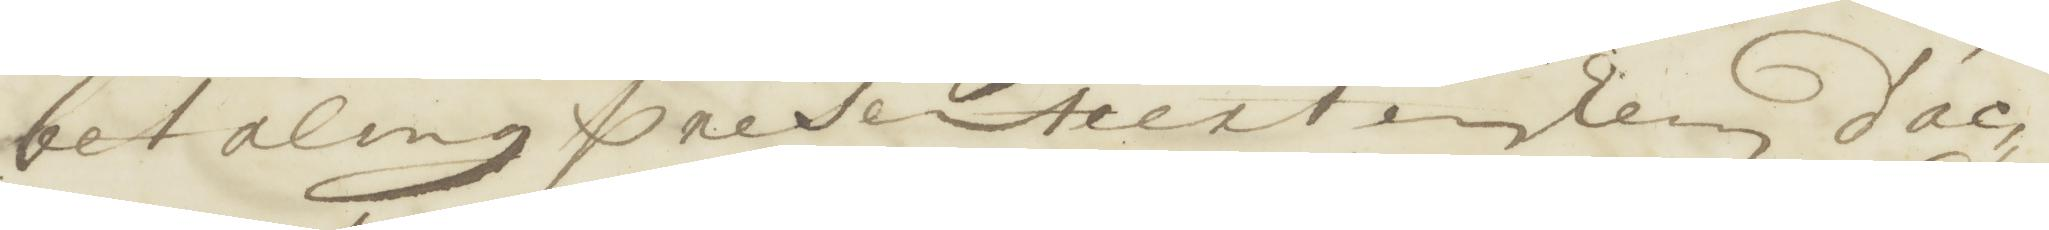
betaling presenteert en hem d'ac„
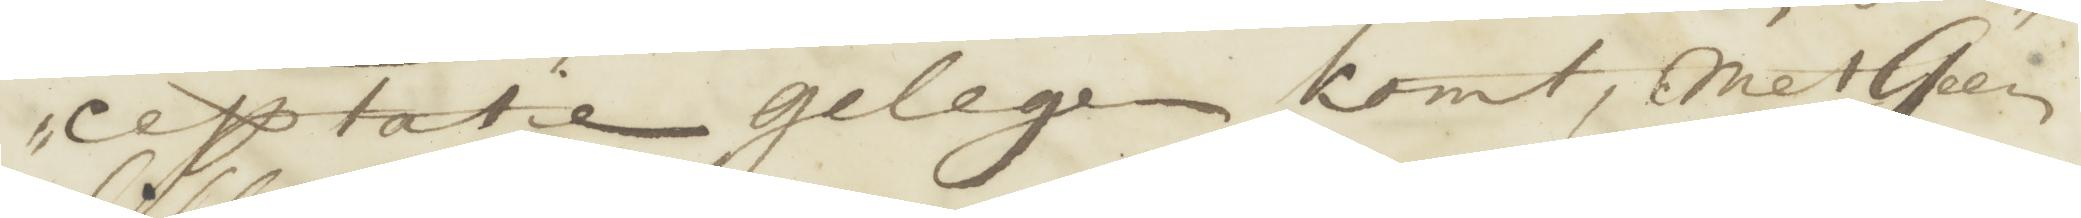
„ceptatie gelegen komt, met geen
